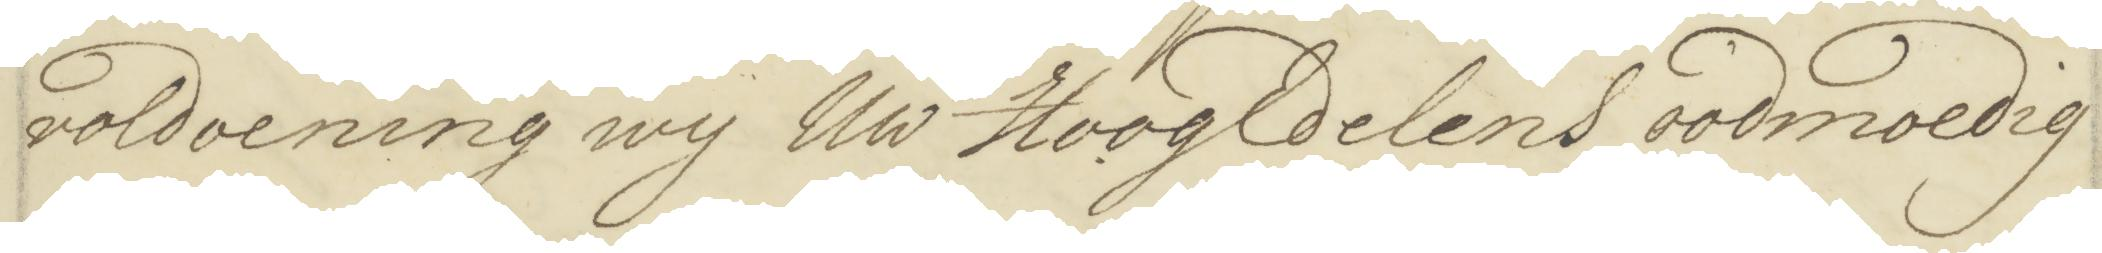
voldoening wij Uw Hoog Edelens oodmoedig
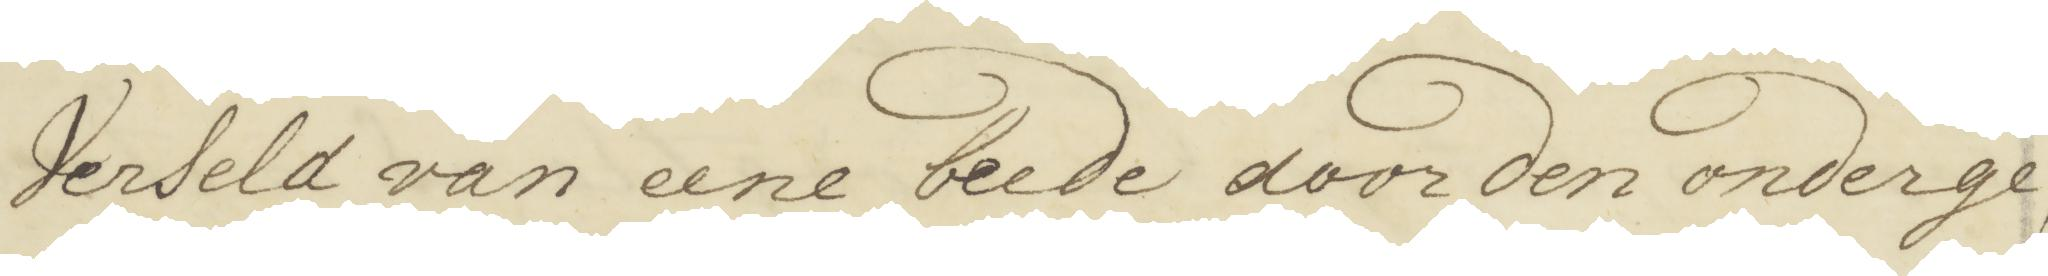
Verseld van eene beede door den onderge
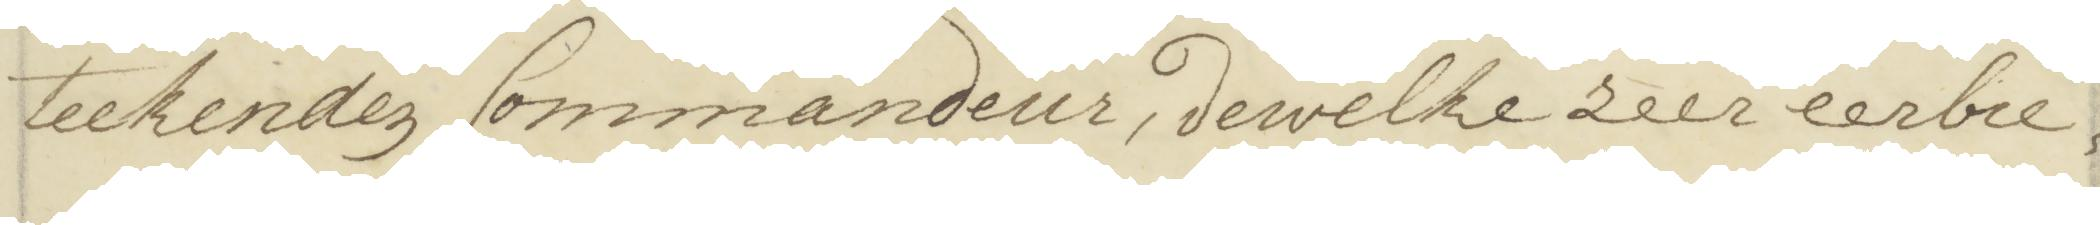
teekenden Commandeur, dewelke zeer eerbie
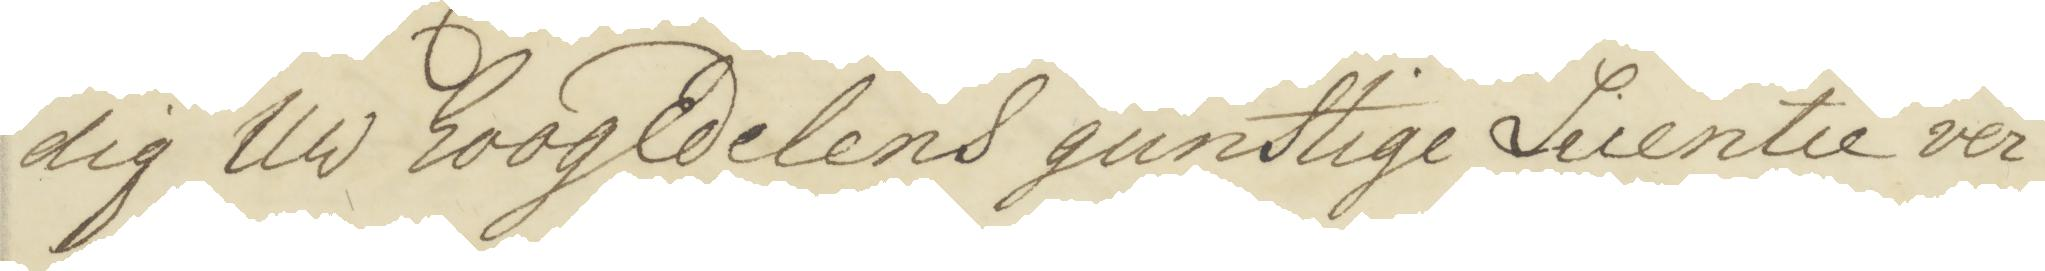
dig uw hoog Edelens gunstige licentie ver
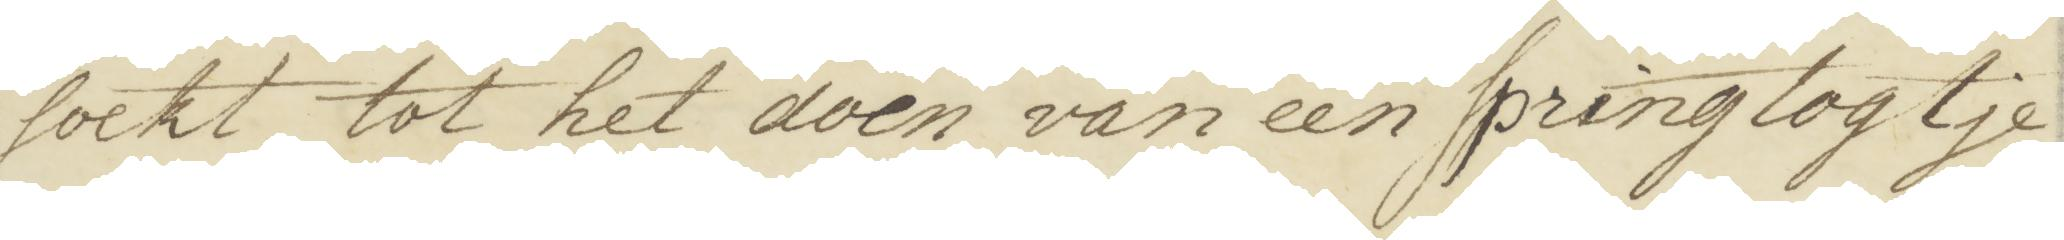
soekt tot het doen van een springtogtje
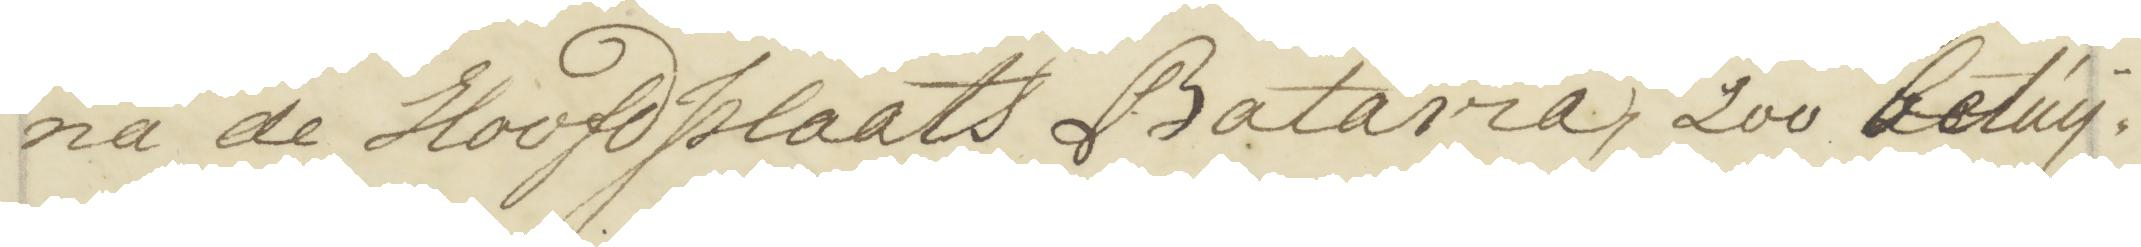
na de Hoofdplaats Batavia, zoo betuij„
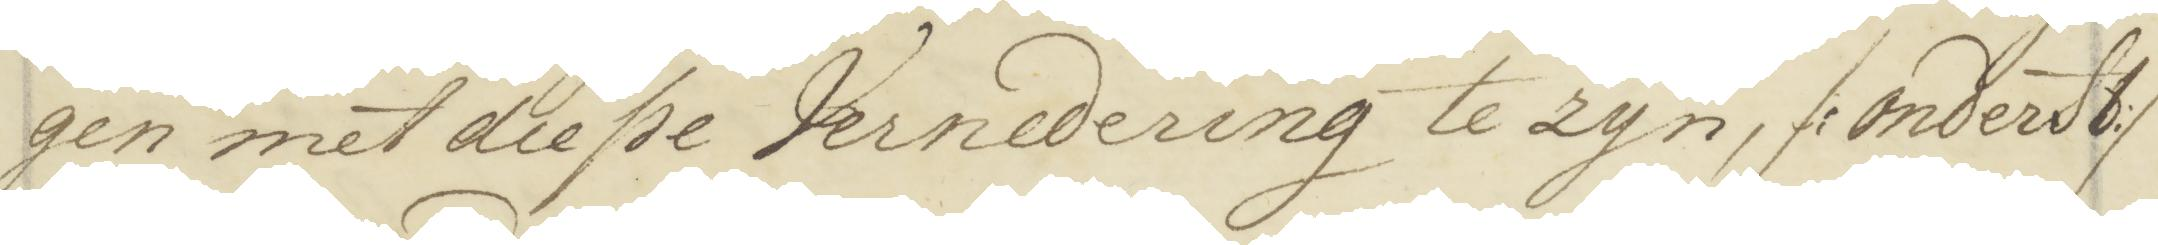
gen met diepe vernedering te zijn, /:onderst:/
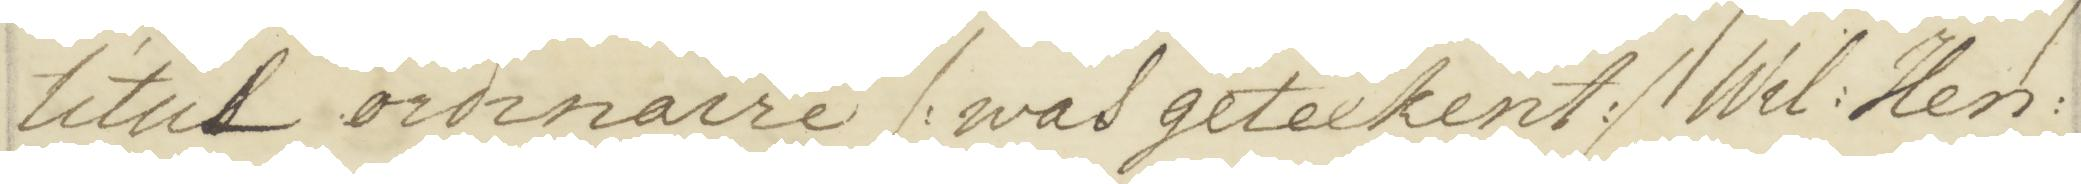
titul ordinaire /:was geteekent:/ Wel: Hen:
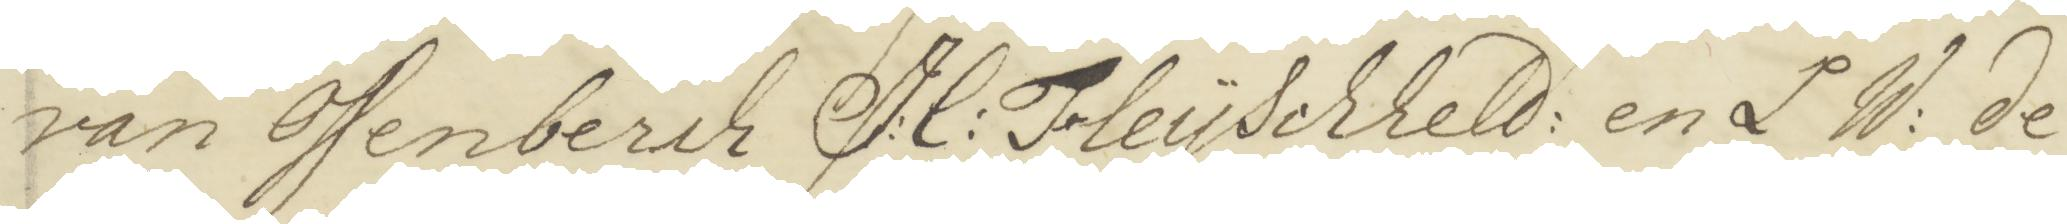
van Ossenberch J:l: Fleijschheld: en L W: de
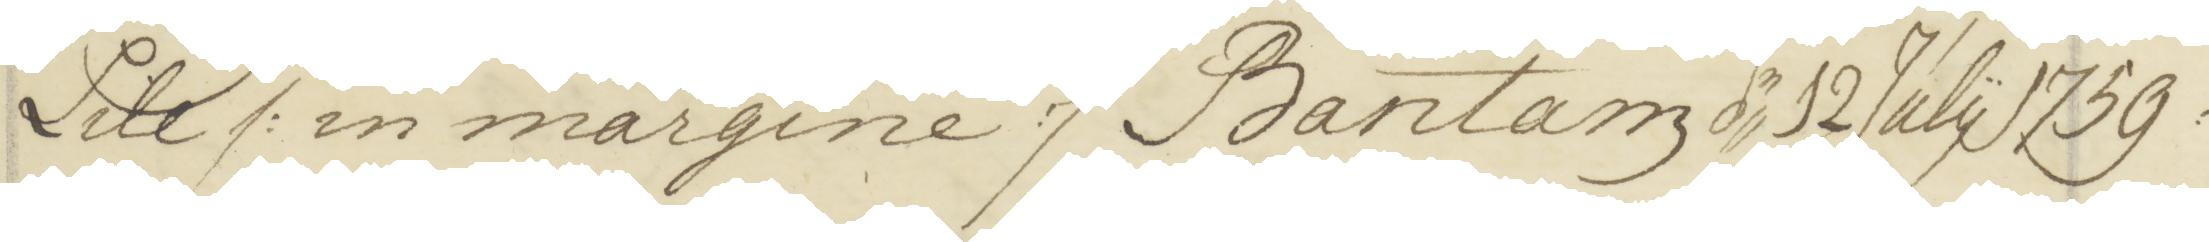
Lile /: in margine :/ Bantam d„n 12 Julij 1759
